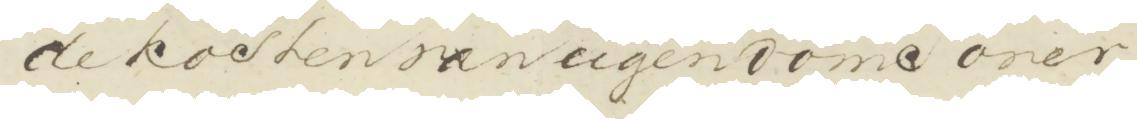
de kosten van eigendoms over
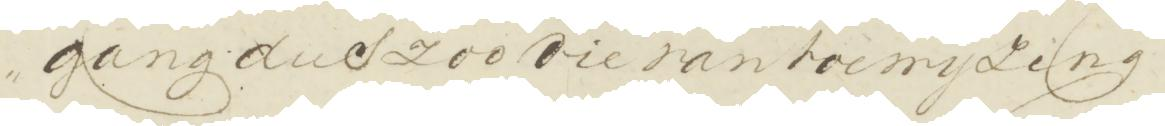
„gang dus zoo die van toewyzing
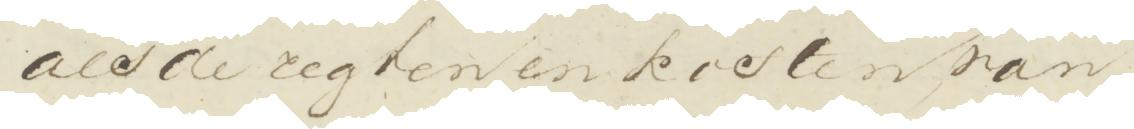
als de regten en kosten van
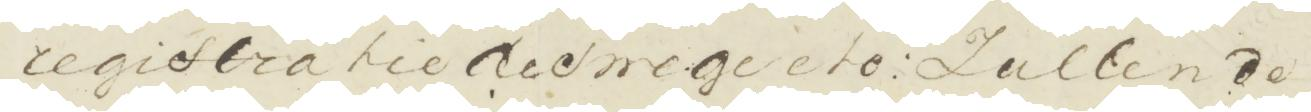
registratie deswege etc: zullen de
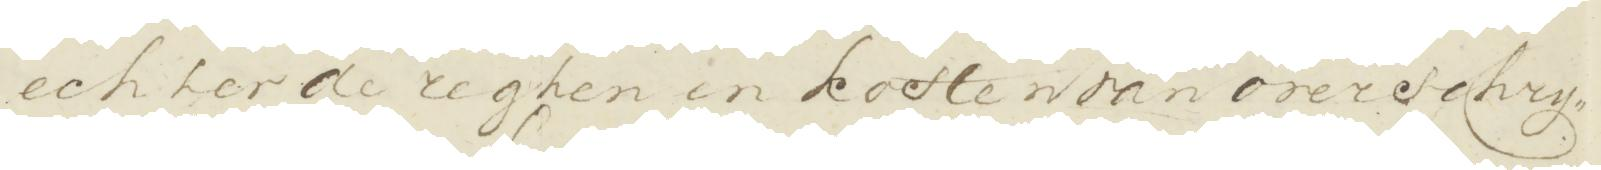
echter de regten en kosten van overschry„
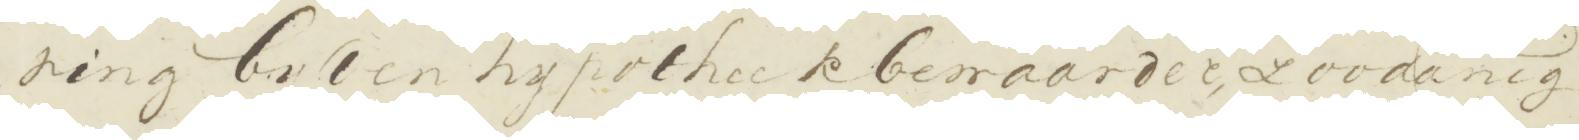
ving by den hypotheek bewaarder, zoodanig
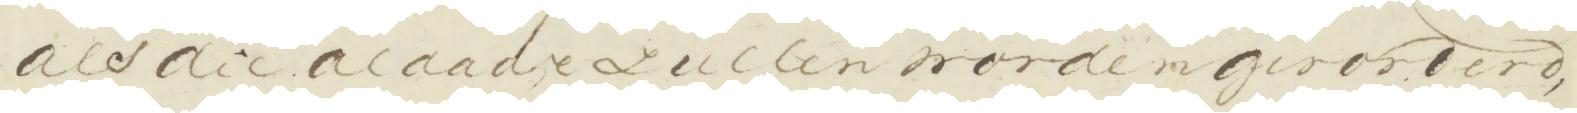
als die aldaar zullen worden gevorderd,
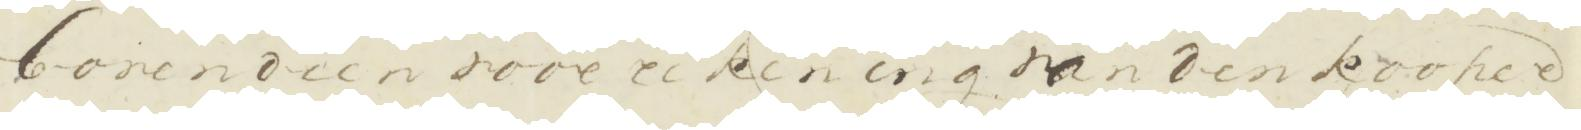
bovendien voor rekening van den kooper
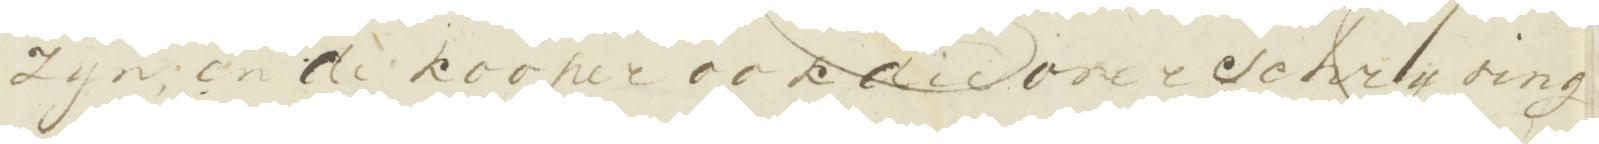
zyn, en de kooper ook die overschrijving
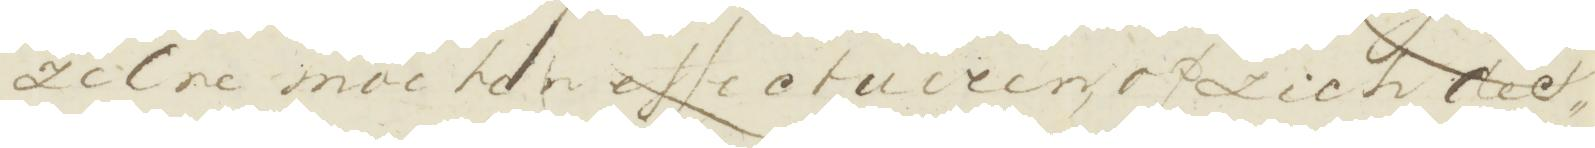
zelve moeten effectueren, of zich des„
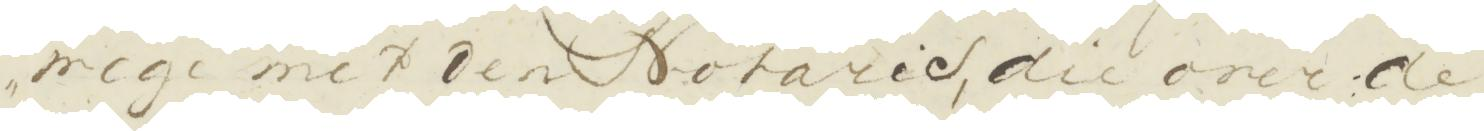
„wege met den Notaris, die over de
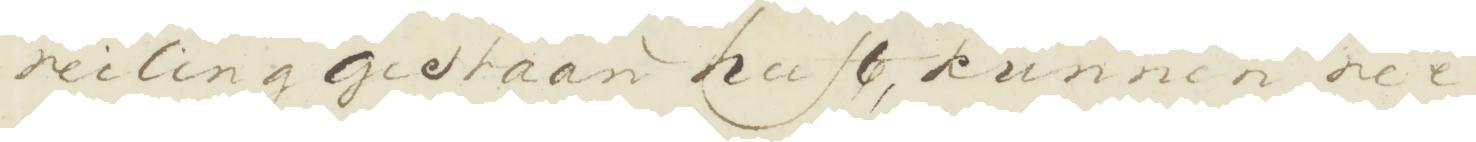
veiling gestaan heeft, kunnen ver
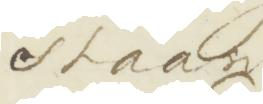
staan.
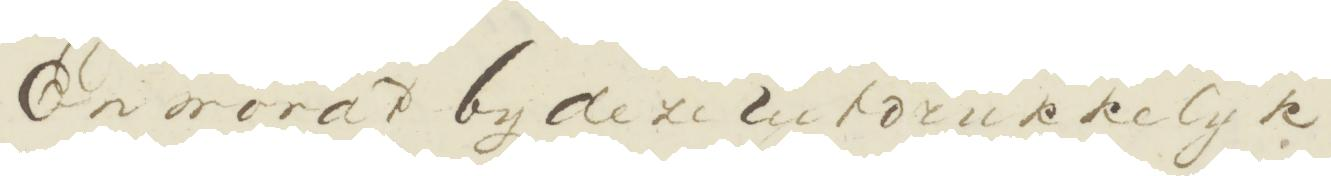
En wordt by deze uitdrukkelyk
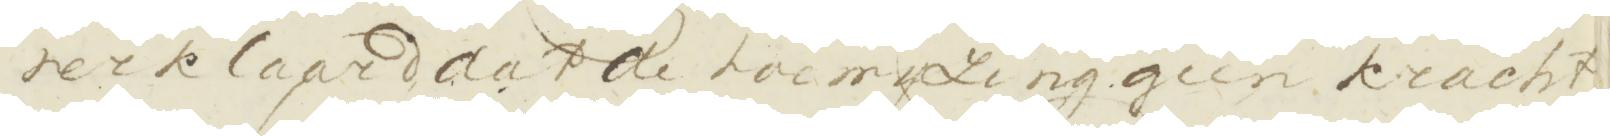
verklaard dat de toewjzing geen kracht
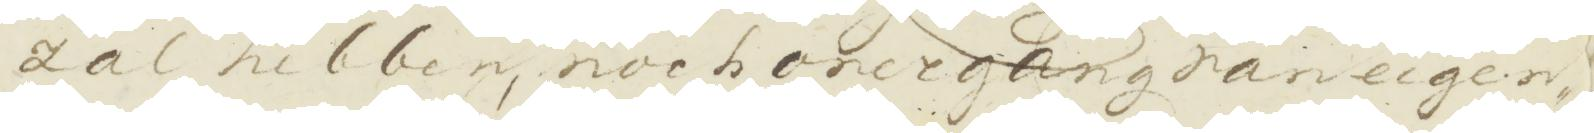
zal hebben, noch overgang van eigen„
